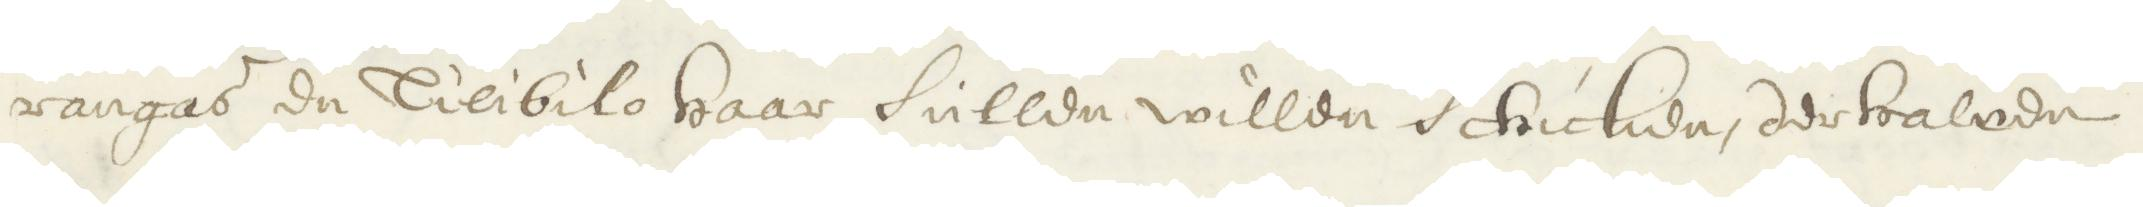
rangas en Tilibilo haar sullen willen schicken, derhalven
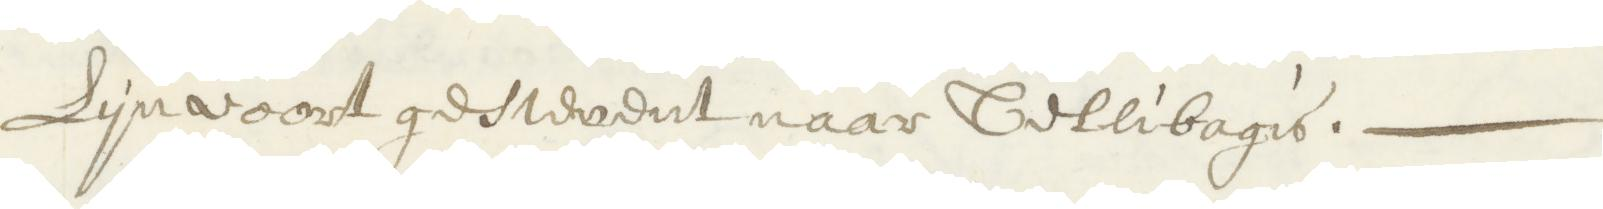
zijn voort gestevent naar Tellibagis. —
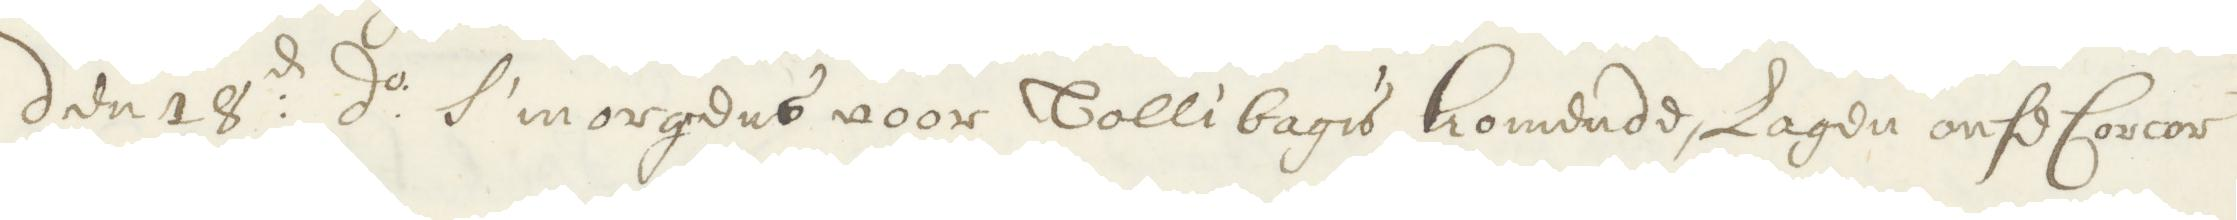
den 18:en d:o s' morgens voor Tollibagis komende, zagen onse Corcor
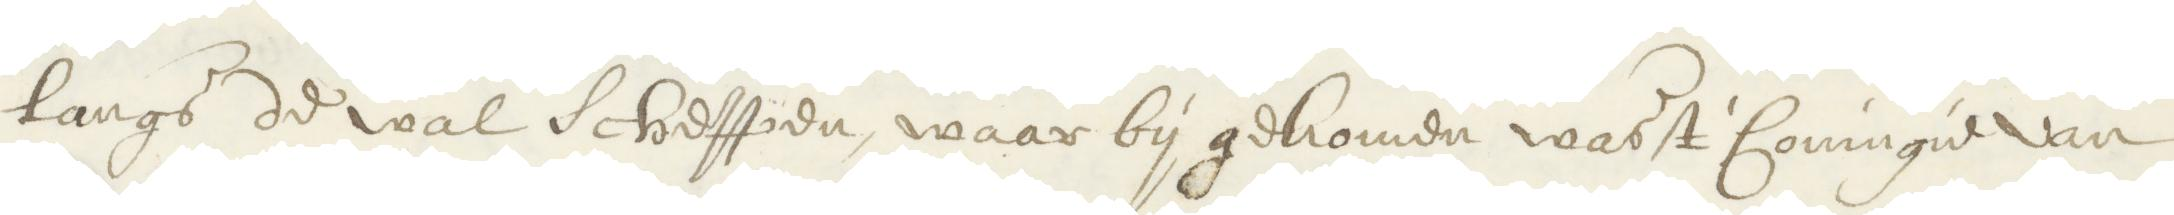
langs de wal scheppen, waar bij gekomen was t' Coningie van
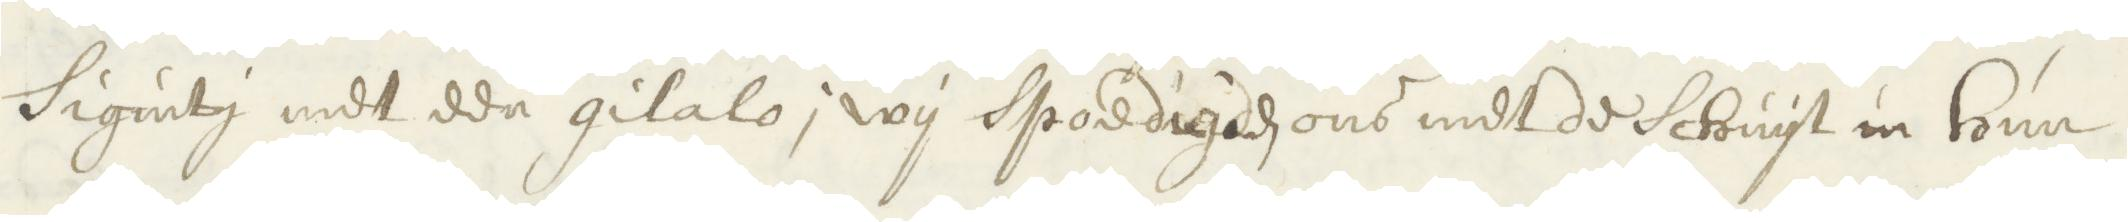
sigintij met een gilalo; wij spoedigden ons met de schuijt in hun
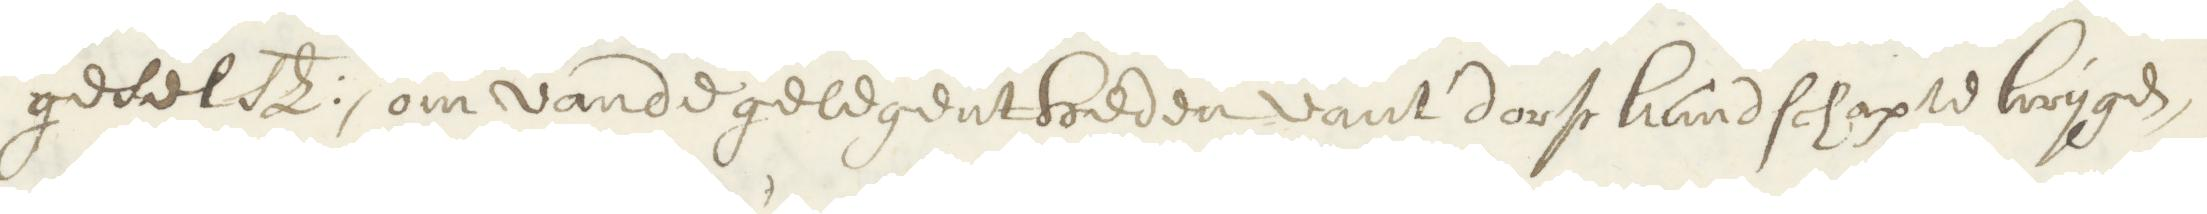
geselsz:, om vande gelegentheden vant dorp kundschap te krijgen,
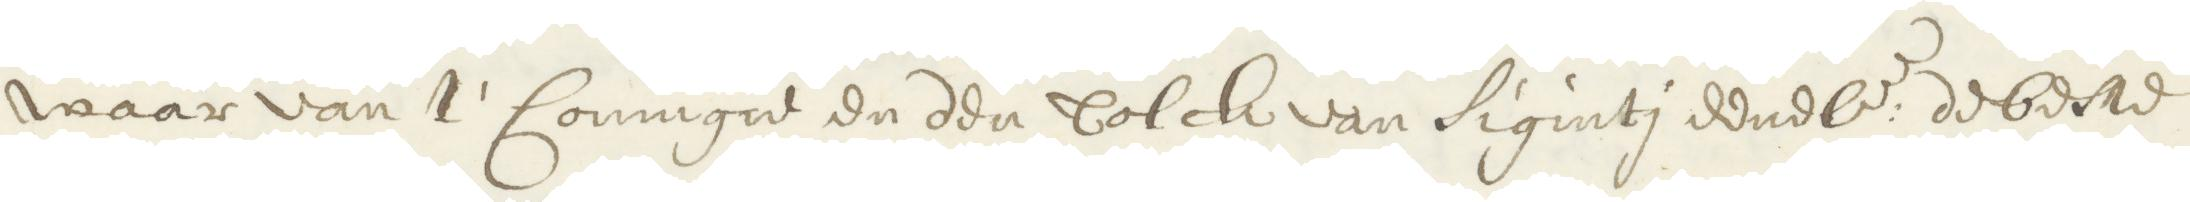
waar van t' Coningie en den tolck van sigintij eenelijk debeste
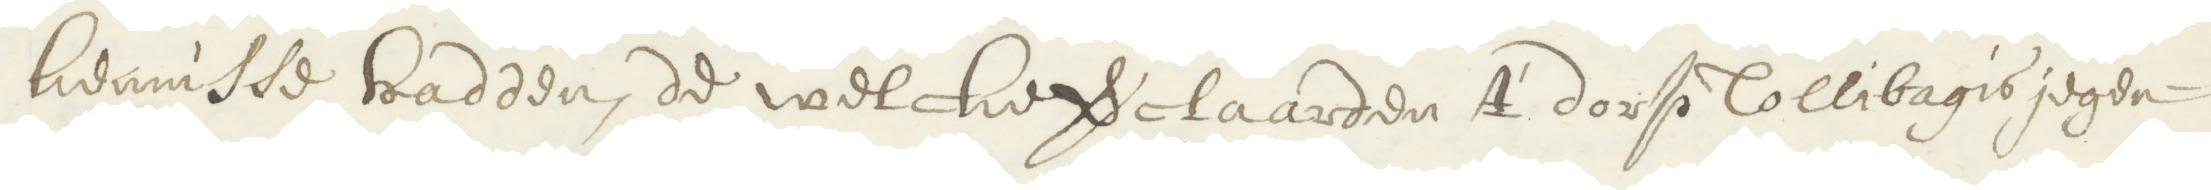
kennisse hadden, de welcke verclaarden t' dorp tollibagis jegen=
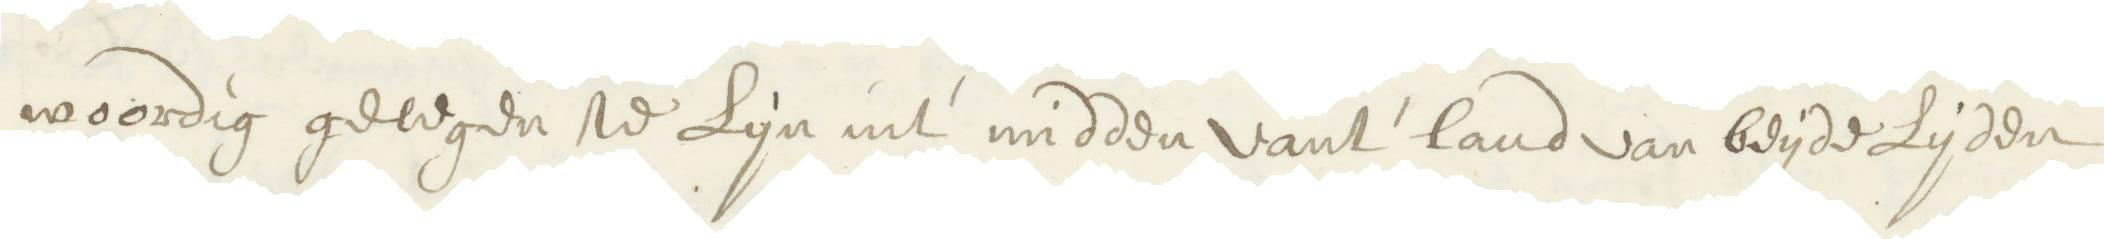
woordig gelegen te zijn int' midden vant' land van beijde zijden
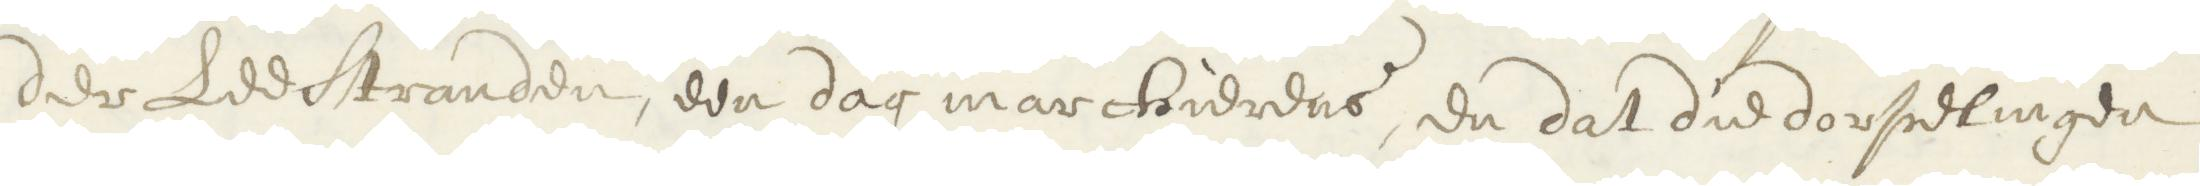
der zeestranden, een dag marchierens, en dat die dorpelingen
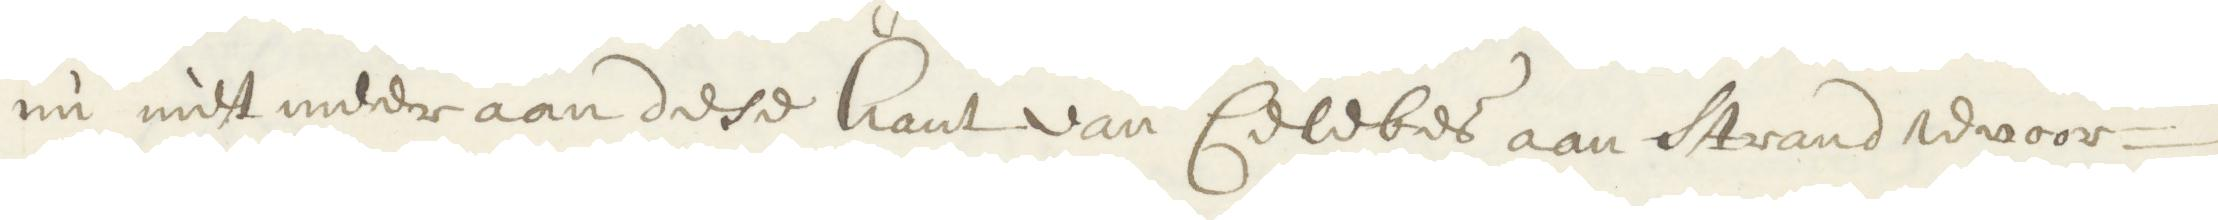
nu niet meer aan dese kant van Celebes aan strand tevoor=
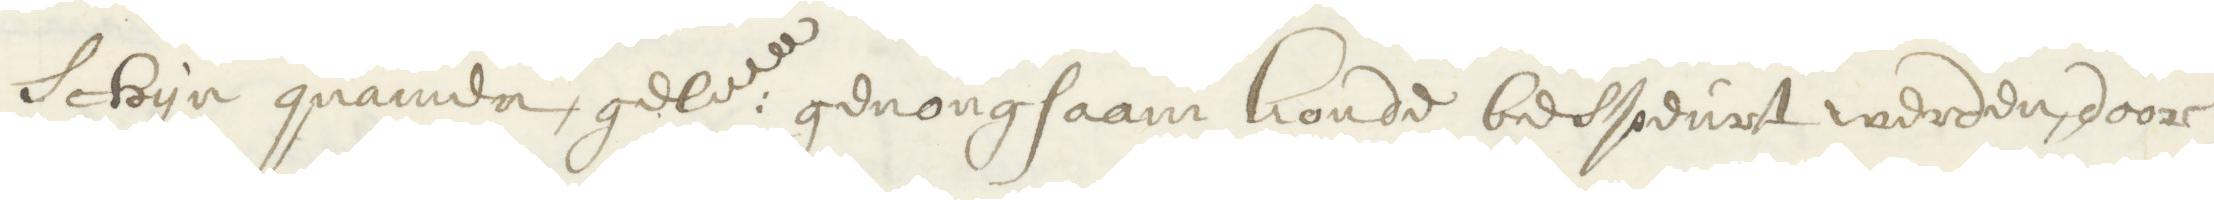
schijn quamen, gelijk genougsaam konde bespeurt werden, door
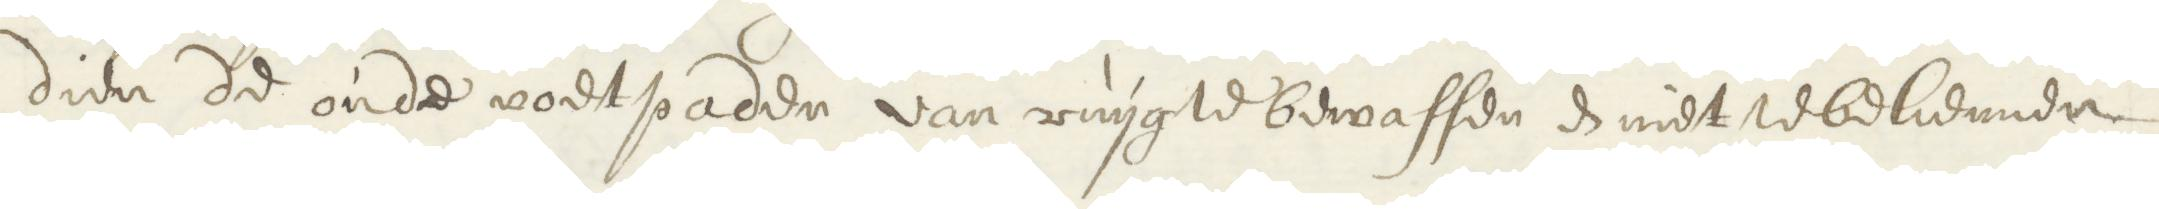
dien de oude voetpaden van ruijgte bewassen en niet te bekennen
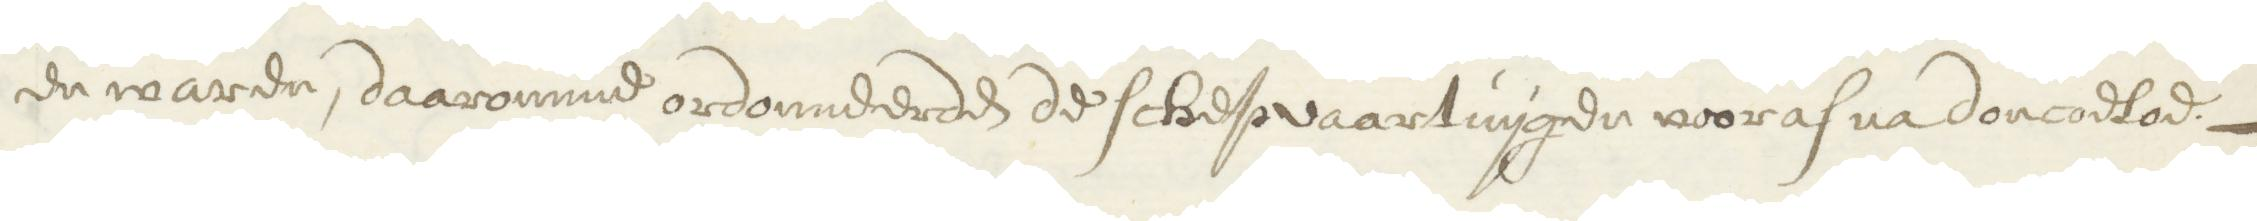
en waren, daaromme ordonneerden de schepvaartuijgen vooraf na doncoeloe. —
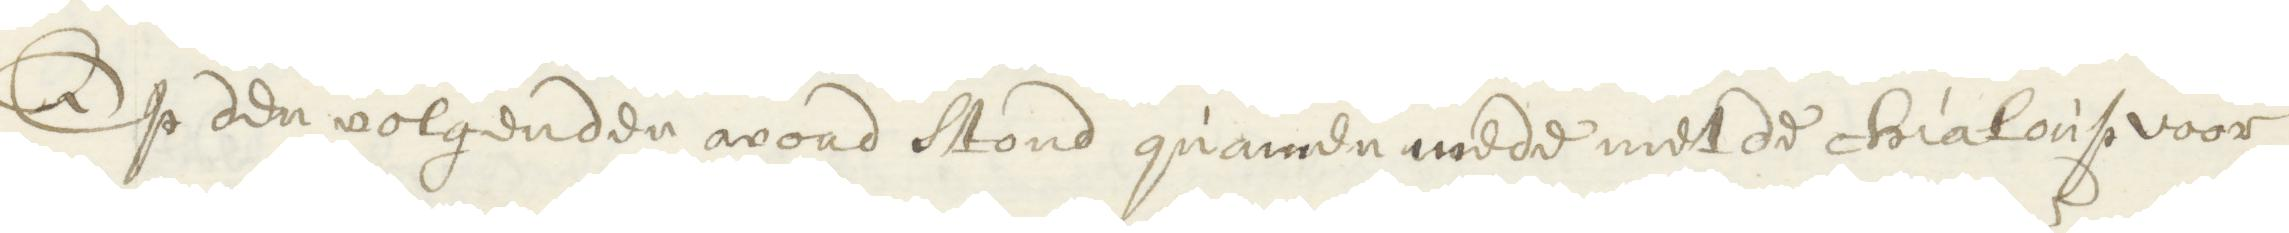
Op den volgenden avond stond quamen mede met de chialoup voor
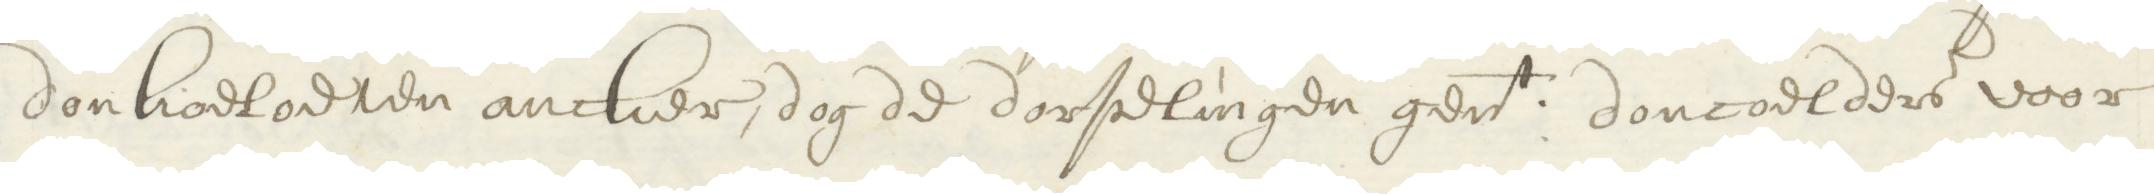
donkoeloeten ancker, dog de dorpelingen gen:t doncoelders voor
